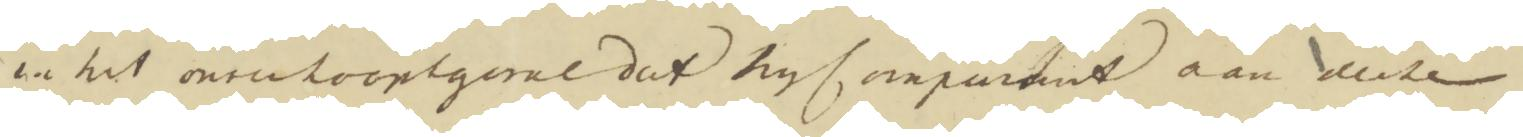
in het onverhooptgeval dat hy Comparant aan deeze
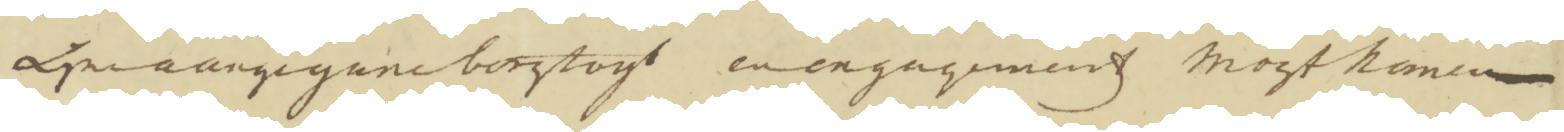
zyn aangegane borgtogt en engagement mogt komen
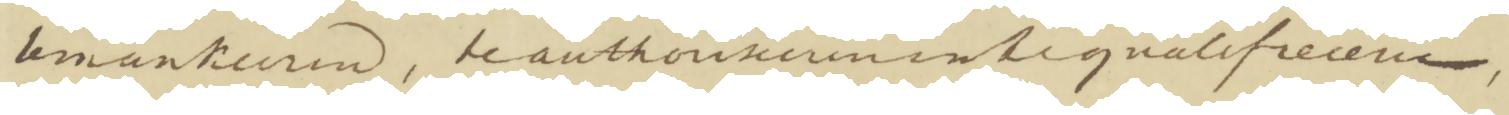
te mankeeren, te authoriseeren en te qualifieceren,
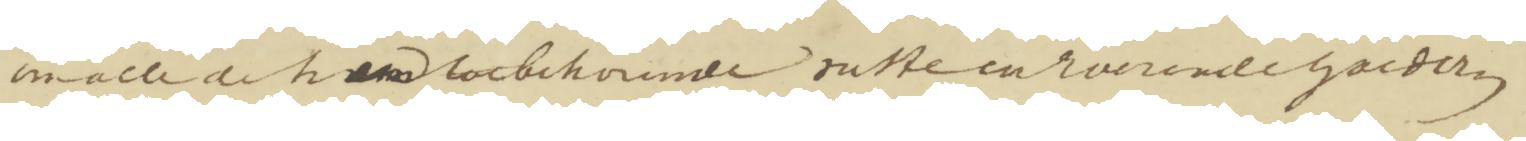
in alle de hem toebehoorde vaste en roerende goederen
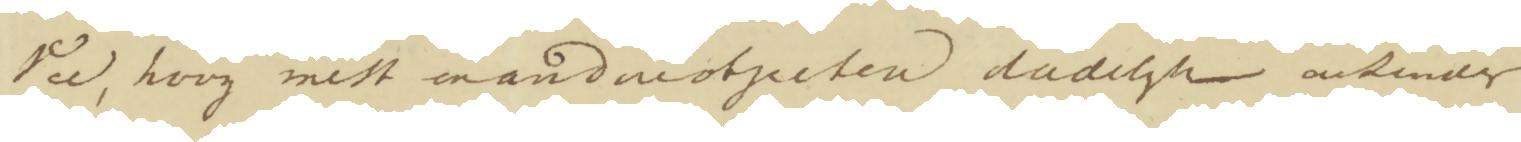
Vee, hoog mest en andere objecten dadelyk en zonder
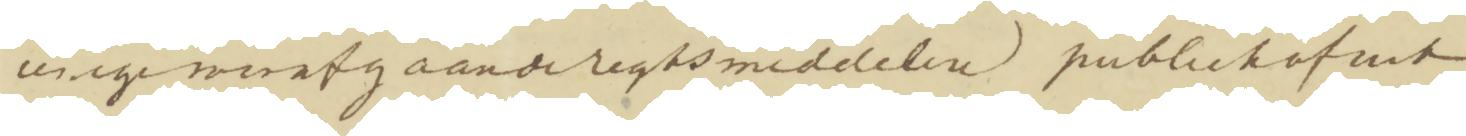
eenige voorafgaande regtsmiddelen publiek of uit
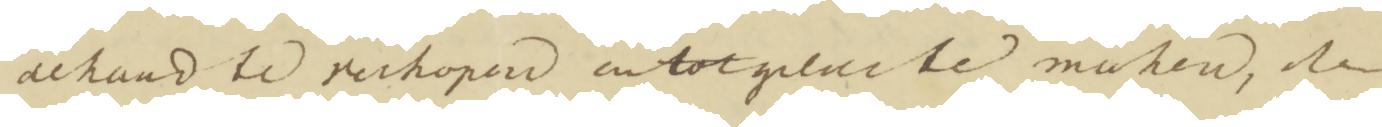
de hand te verkopen en tot gelde te maken, de
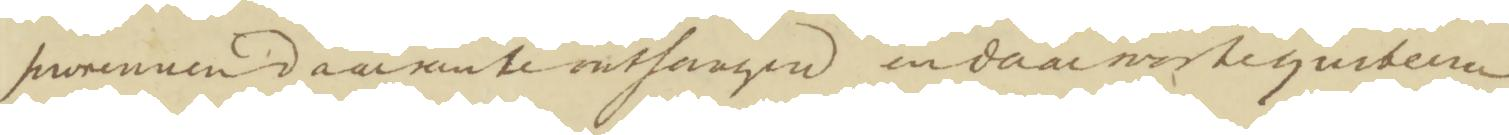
provenuen daarvan te ontfangen en daarvoor te quiteeren
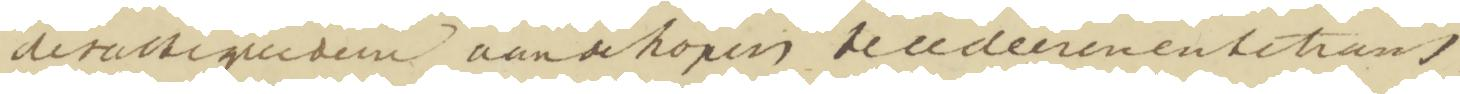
de volle goederen aan de kopers te cedeeren en te trans
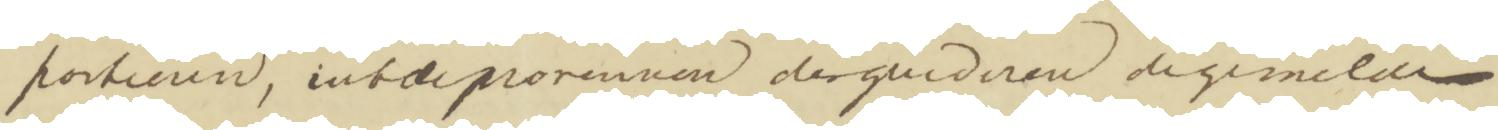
porteeren, int de provenuen der goederen de gemelde
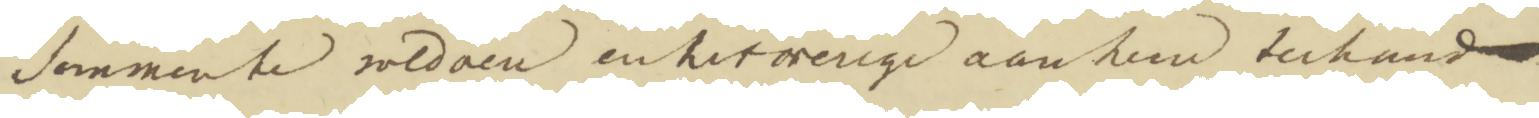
sommen te voldoen en het overige aan hem ter hand
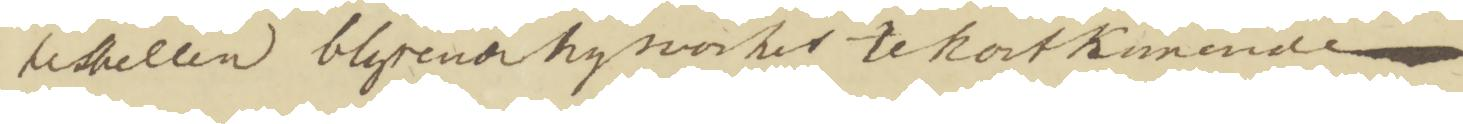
te stellen blyvende hy voor het te kortkomende
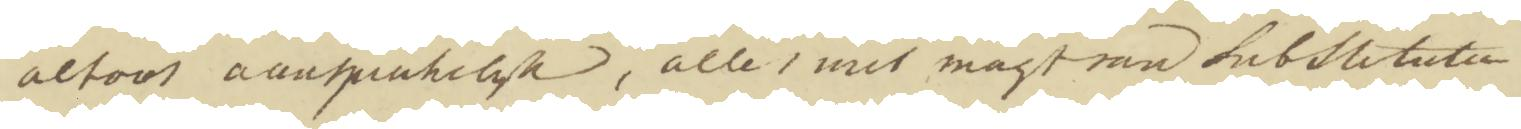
altoos aansprakelyk, alle, met magt van substituten
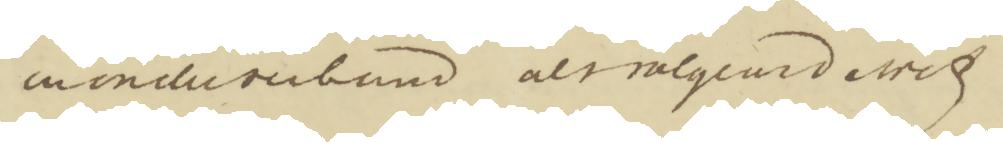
en onder verband als volgend acte.
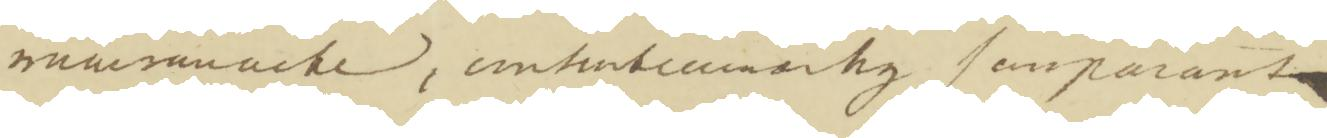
waarvan acte, consenteerende hy Comparant
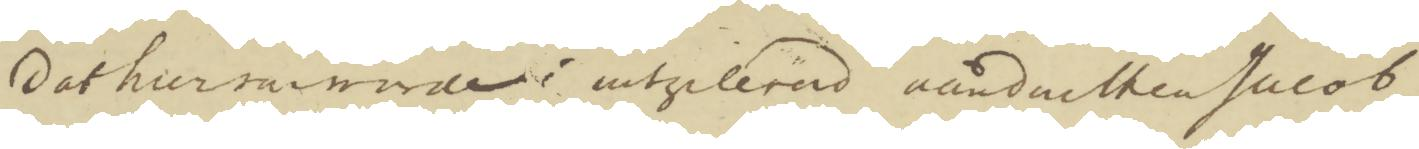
dat hier van worde uitgeleverd aan de Hen Jacob
